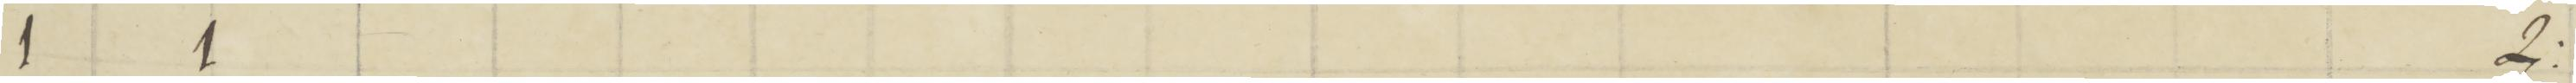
1 1 2:
